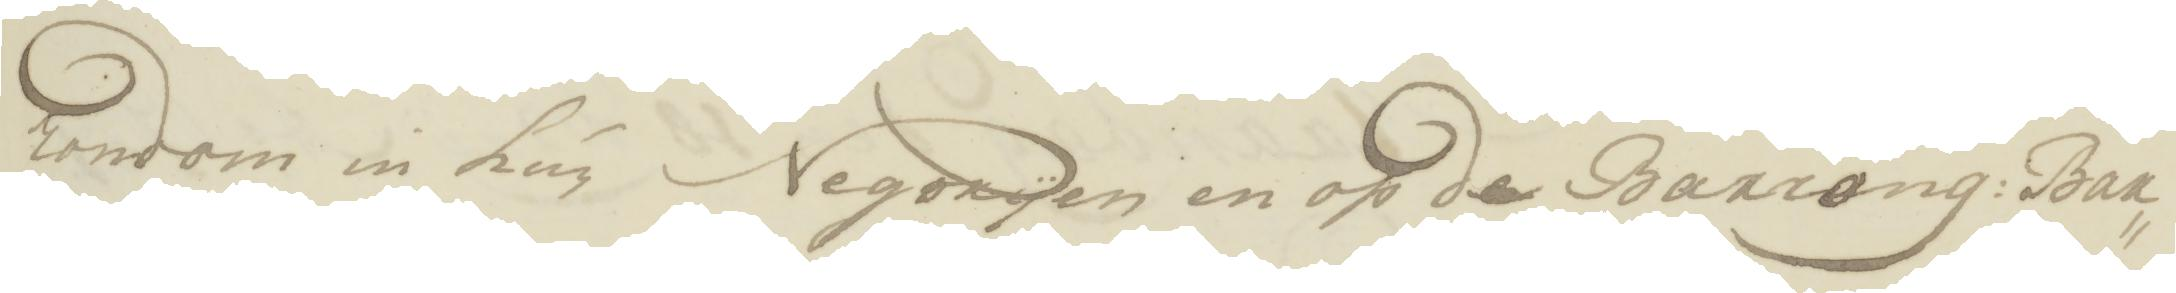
rondom in hun Negorijen en op de Barrong: Bar„
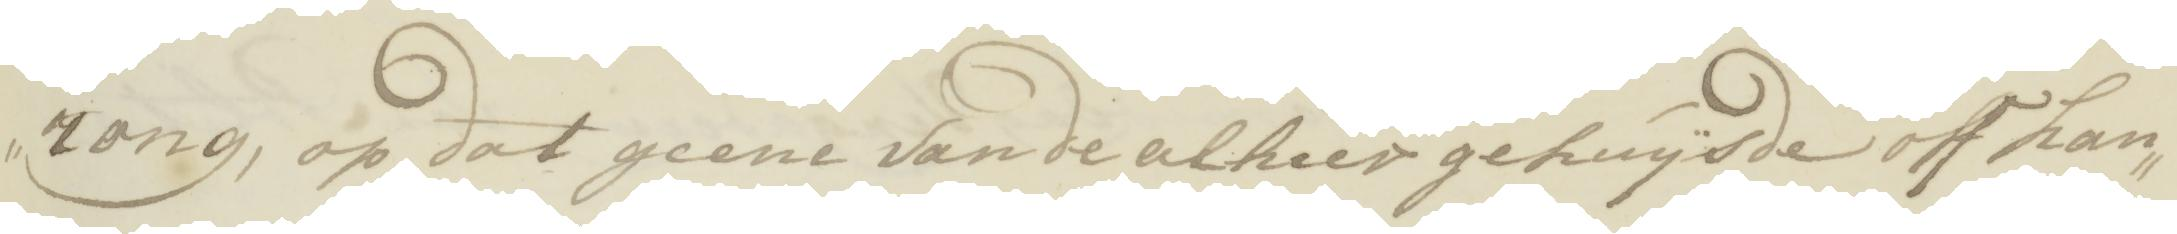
„rong, op dat geene van de alhier gehuijsde off han„
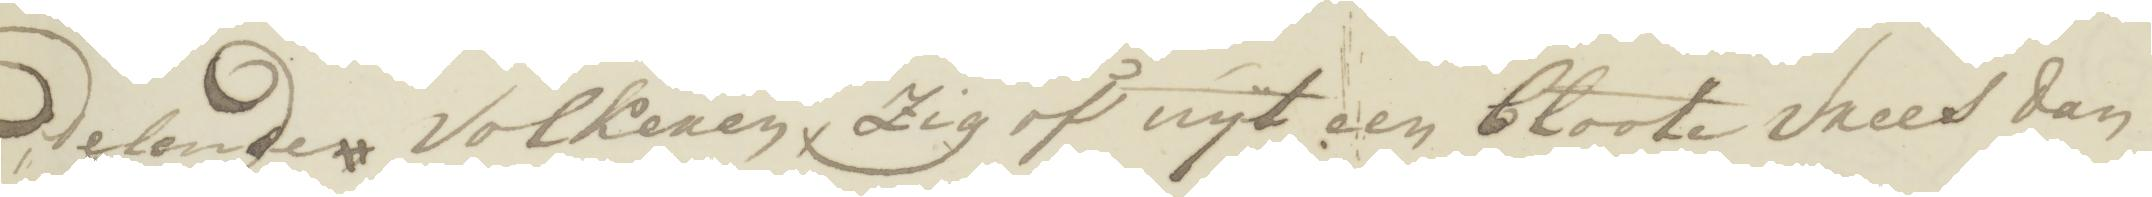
delenden volkeren, zig of uijt een bloote vrees dan
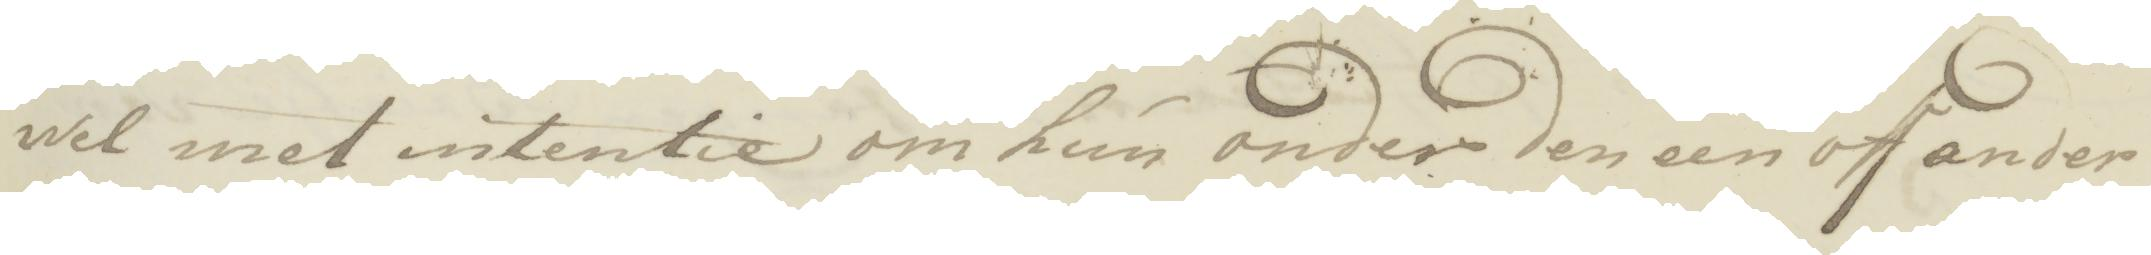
wel met intentie om hun onder den een off ander
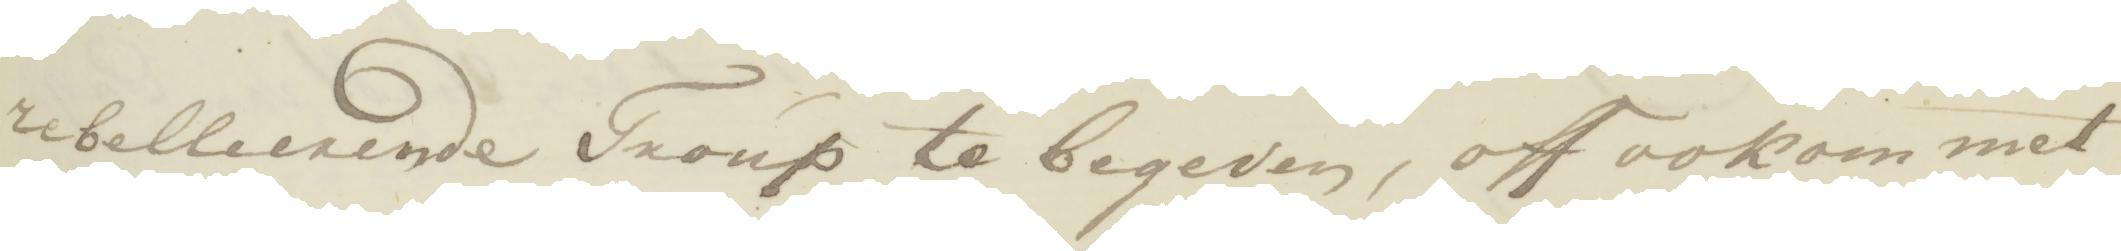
rebelleerende Troup te begeven, off ook om met
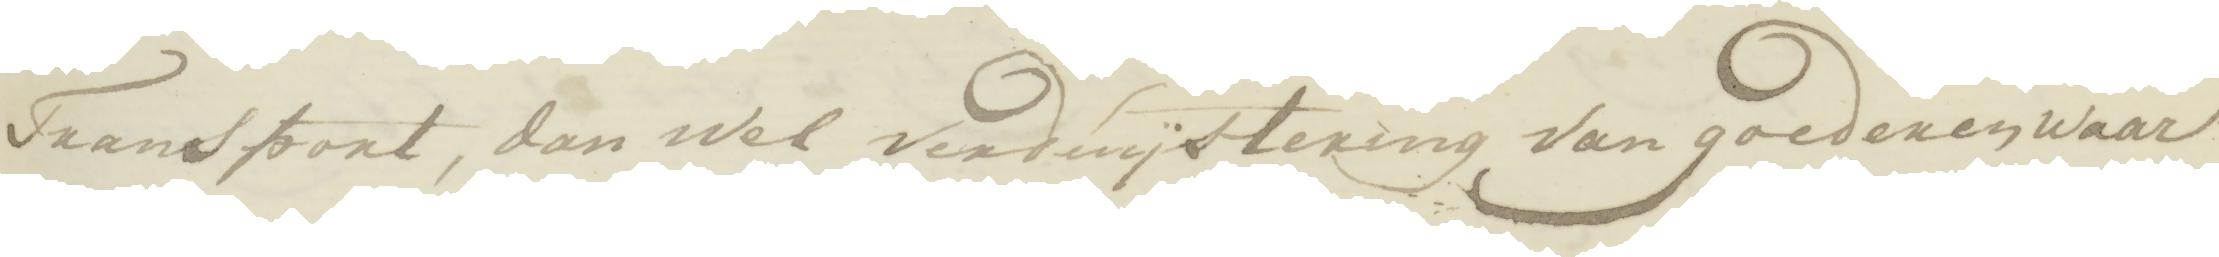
Transport, dan wel verduijstering van goederen waar
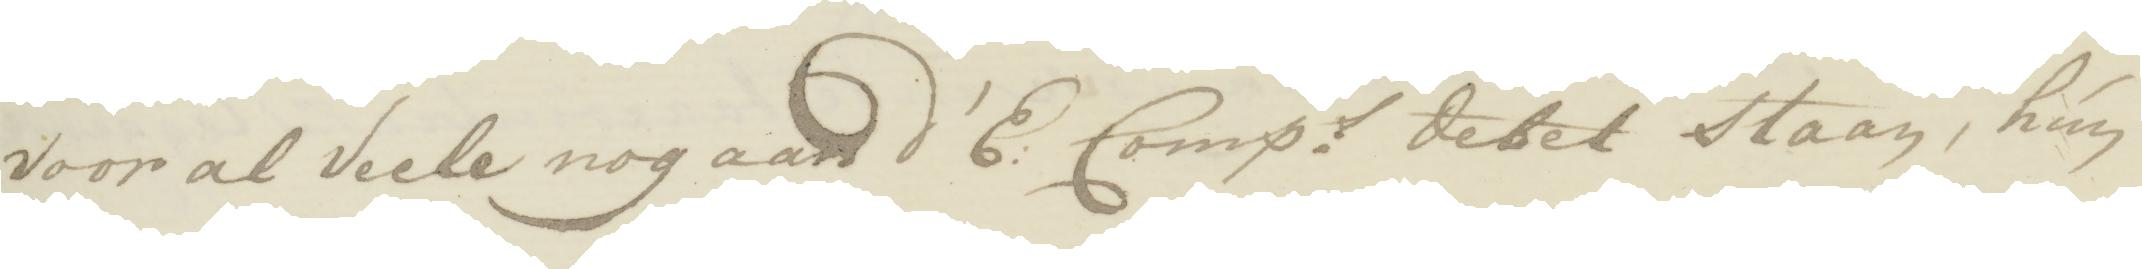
voor al veele nog aan d’ E: Comp:s debet staan, hun
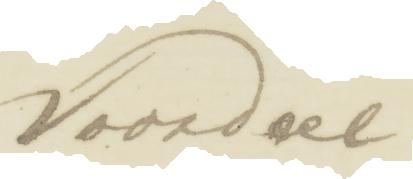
voordeel
